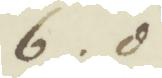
6. d
